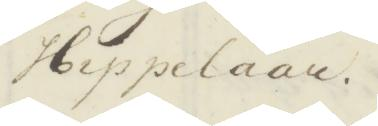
Hippelaar.
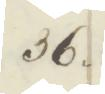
36.
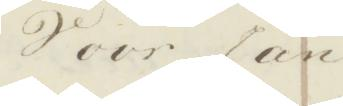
Voor Jan
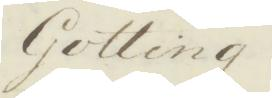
Gotting
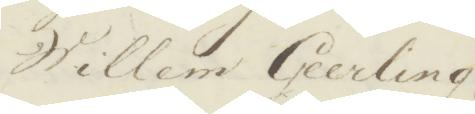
Willem Geerling
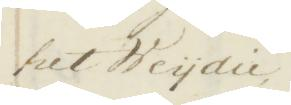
het Weijdie,
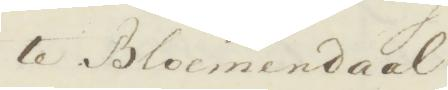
te Bloemendaal
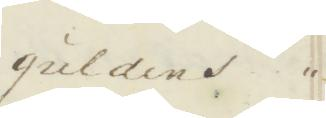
guldens. . „
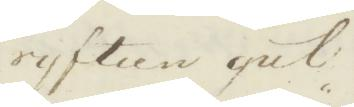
vyftien gul„
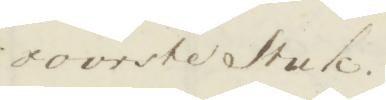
voorste stuk.
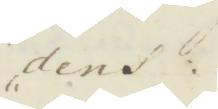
„dens:
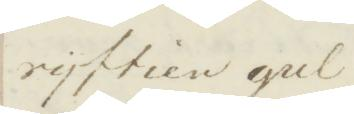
vijftien gul
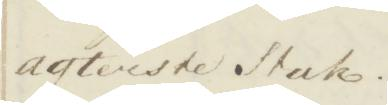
agterste stuk.
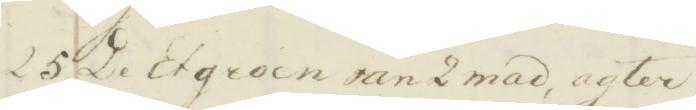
25 De Etgroen van 2 mad, agter
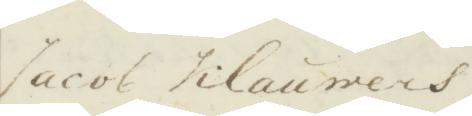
Jacob Klauwers
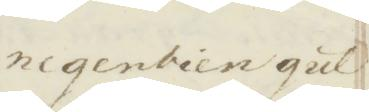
negentien gul
